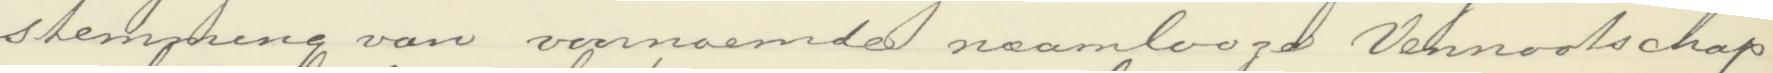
stemming van voornoemde naamlooze Vennootschap
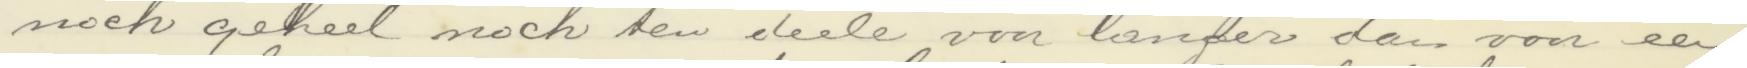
noch geheel noch ten deele voor langer dan voor een
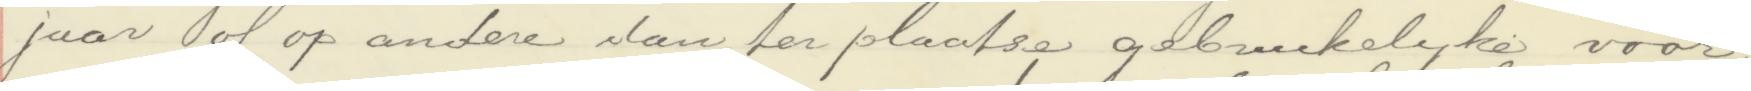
jaar of op andere dan ter plaatse gebruikelyke voor
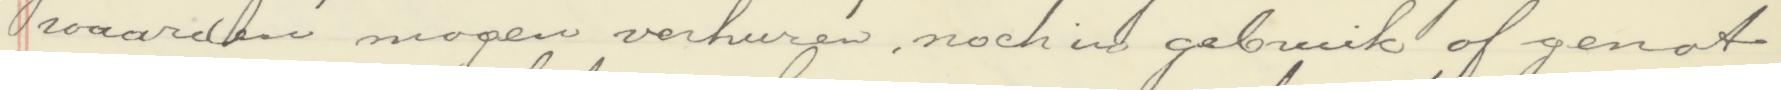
waarden mogen verhuren, noch in gebruik of genot
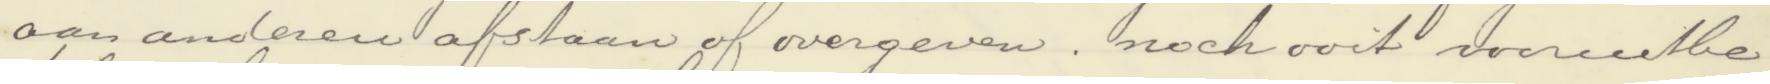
aan anderen afstaan of overgeven, noch ooit vooruitbe
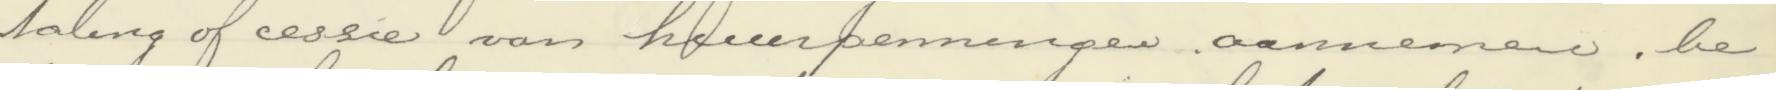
taling of cessie van huurpenningen aannemen, be
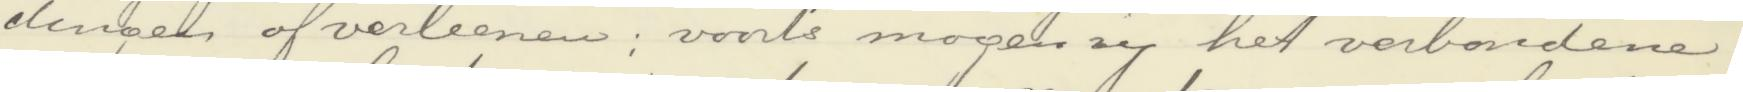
dingen of verleenen; voorts mogen zij het verbondene
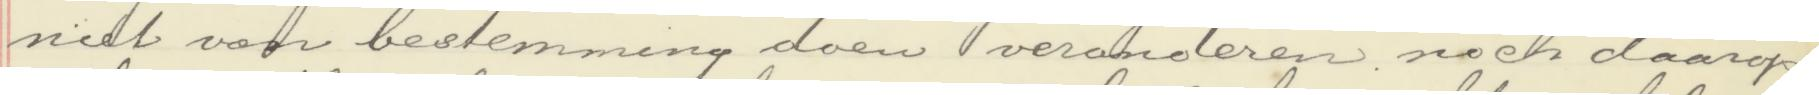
niet voor bestemming doen veranderen, noch daarop
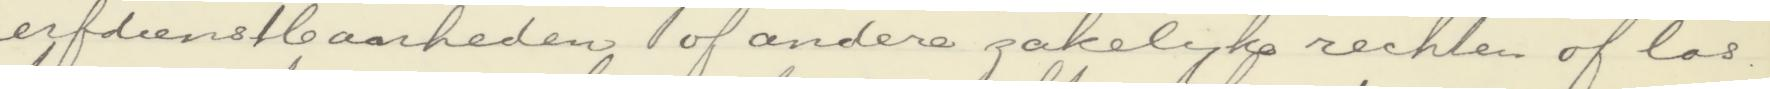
erfdienstbaarheden of andere zakelijke rechten of las.
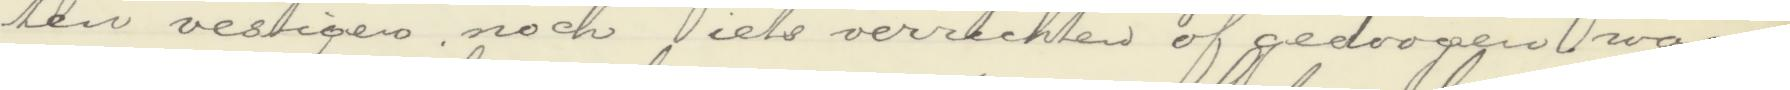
ten vestigen, noch iets verrichten of gedoogen waar
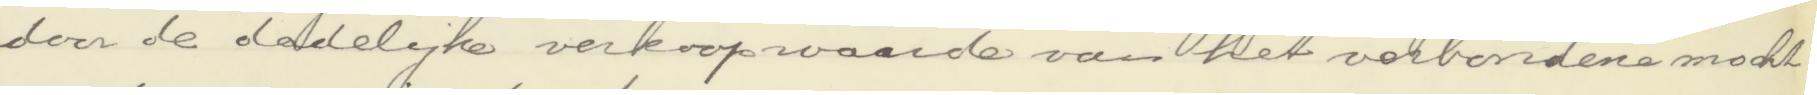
door de dadelijke verkoopwaarde van het verbondene mocht
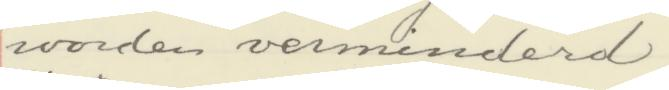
worden verminderd
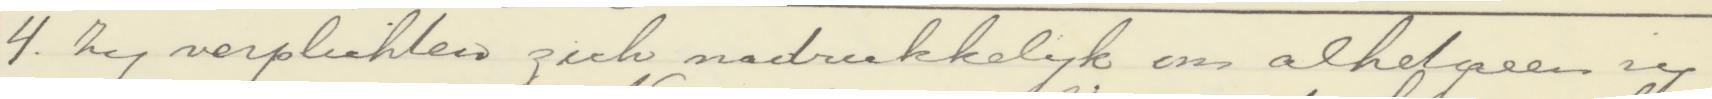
4. Zy verplichten zich nadrukkelyk om alhet geen zij
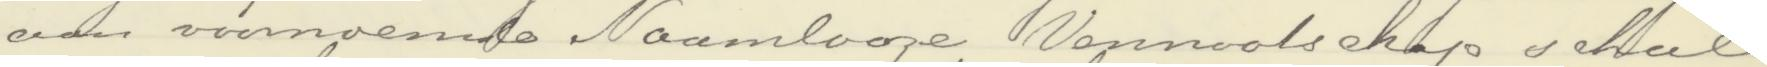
aan voornoemde Naamlooze Vennootschap schul
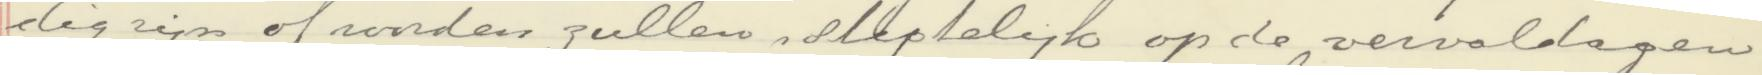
dig zijn of worden zullen, stiptelijk op de vervaldagen
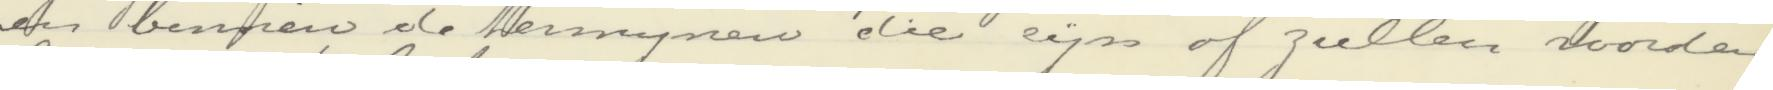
en binnen de termynen die zijn of zullen worden
